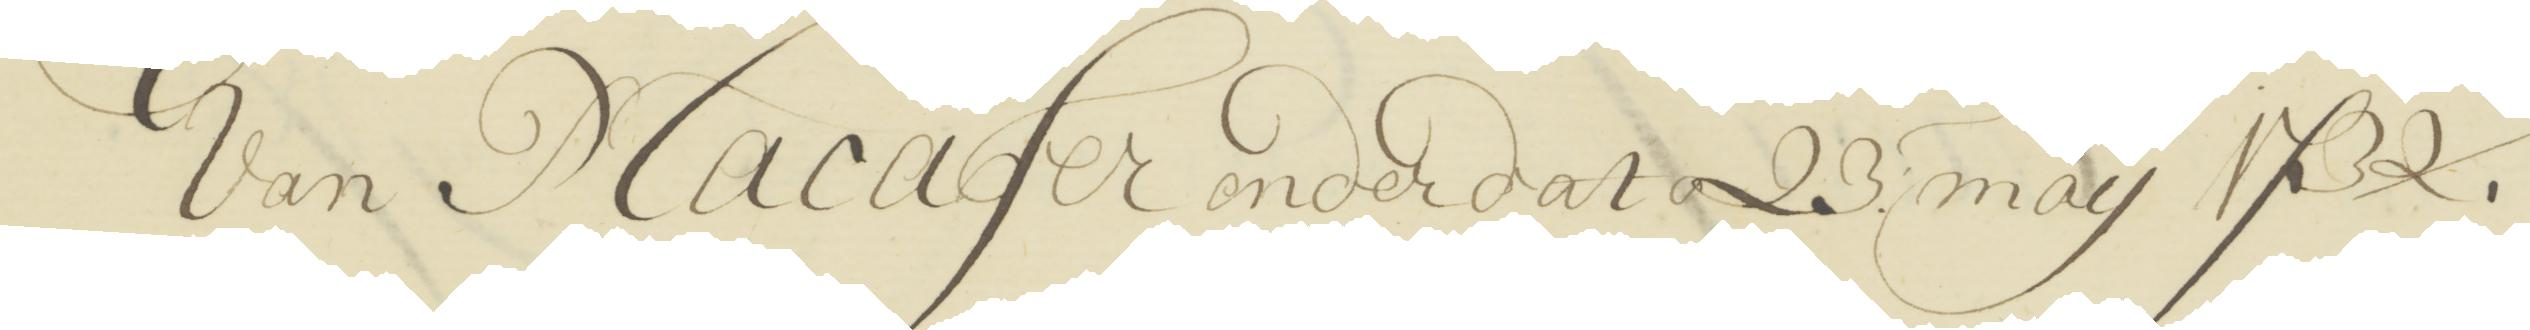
Van Macasser onder dato 23:' maij 1732.
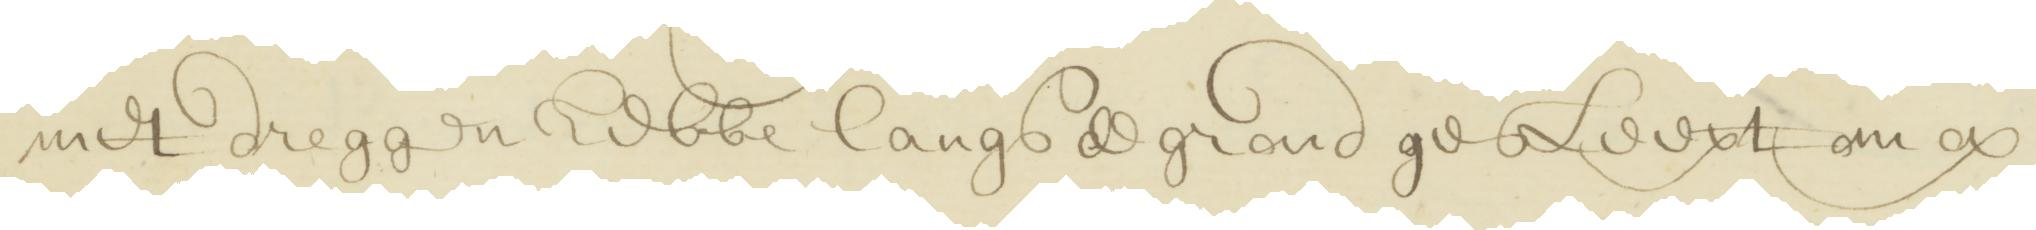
met dreggen hebbe langs de grond gesleept om op
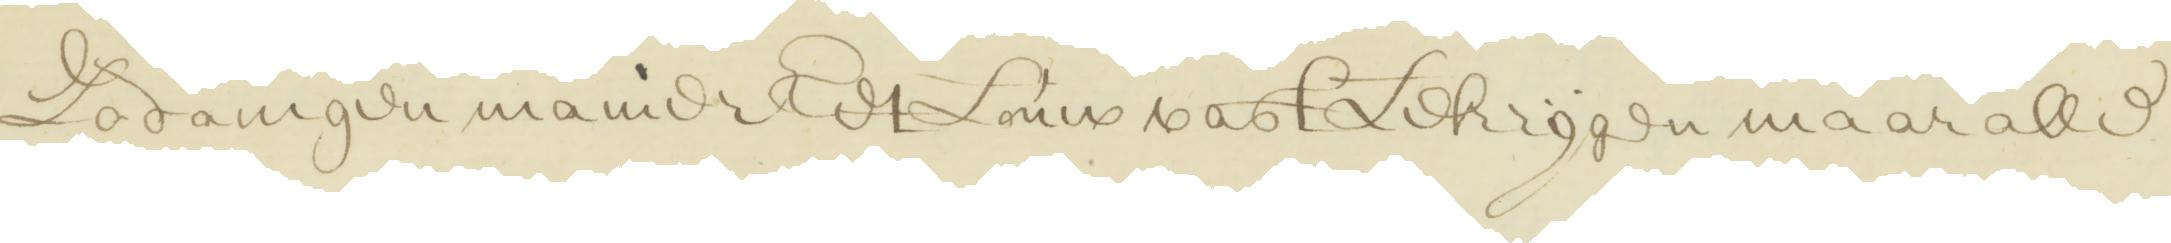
zodanigen manier het touw vast te krijgen maar alle
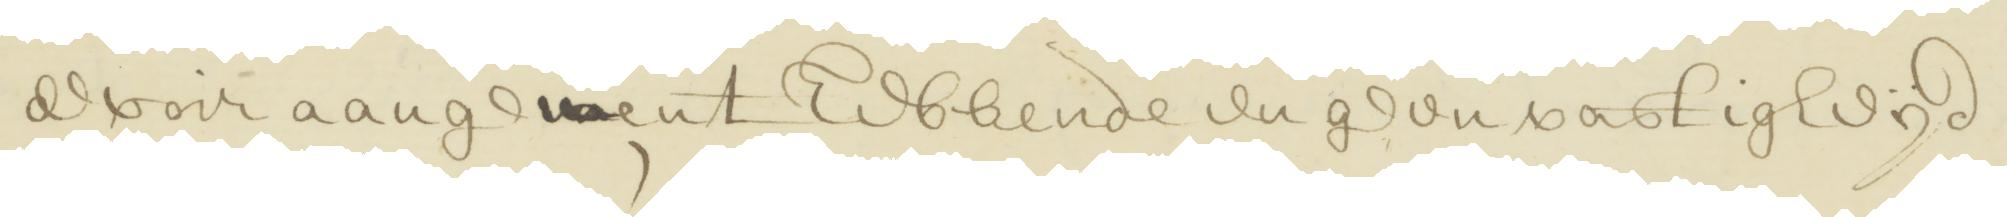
devoir aangewent hebbende en geen vastigheijd
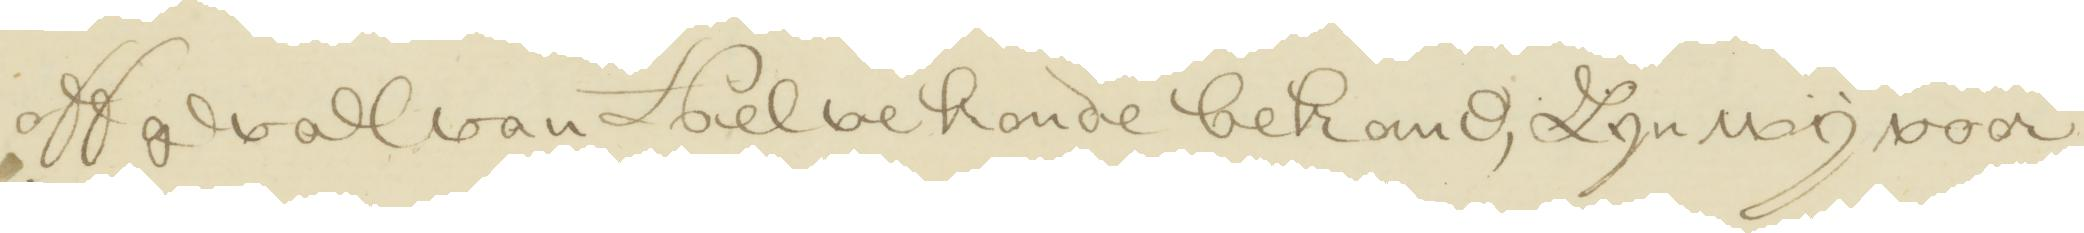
off gevoel van 't selve konde bekome, zijn wij voor
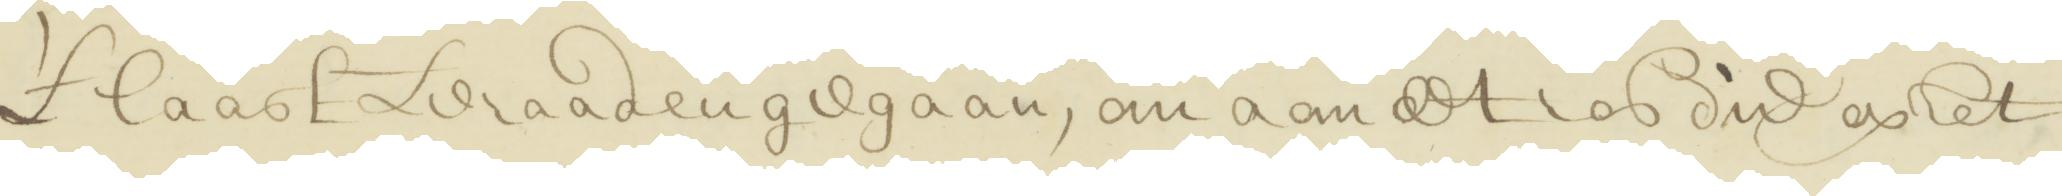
't laast teraaden gegaan, om aan de tros die op het
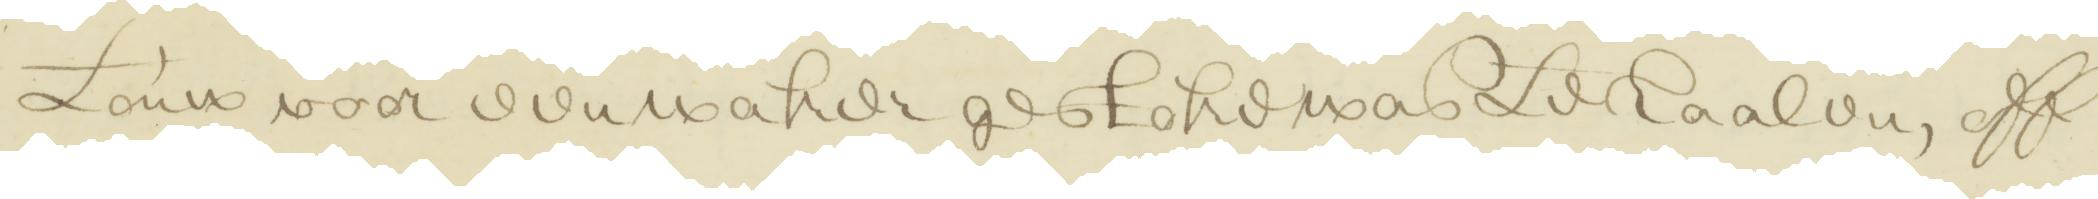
touw voor een waker gestoke was te haalen, off
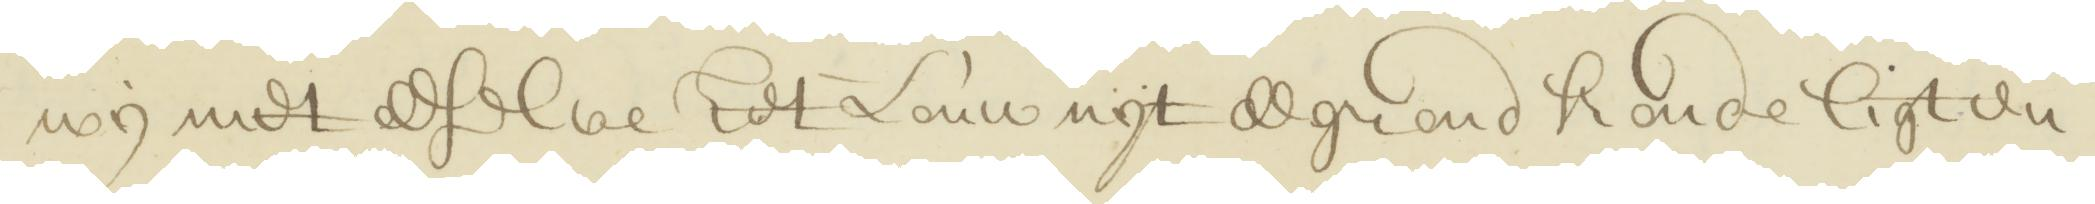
wij met deselve het touw uijt de grond konde ligten
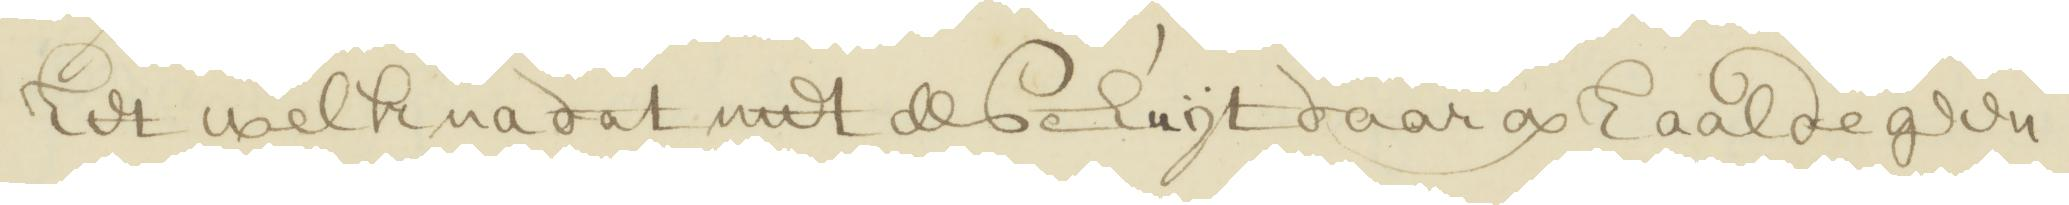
het welk na dat met de schuijt daar op haalde geen
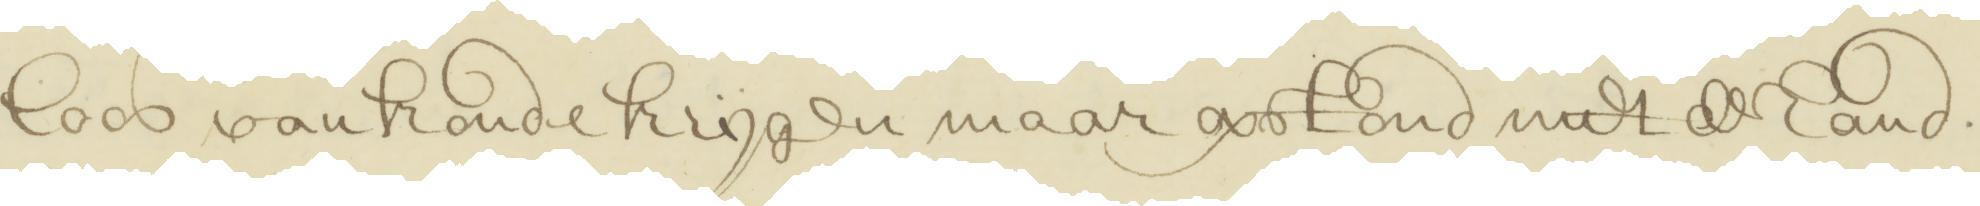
loos van konde krijgen maar opstond met de hand
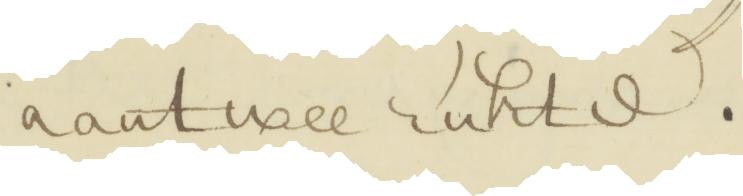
aan twee rukte.
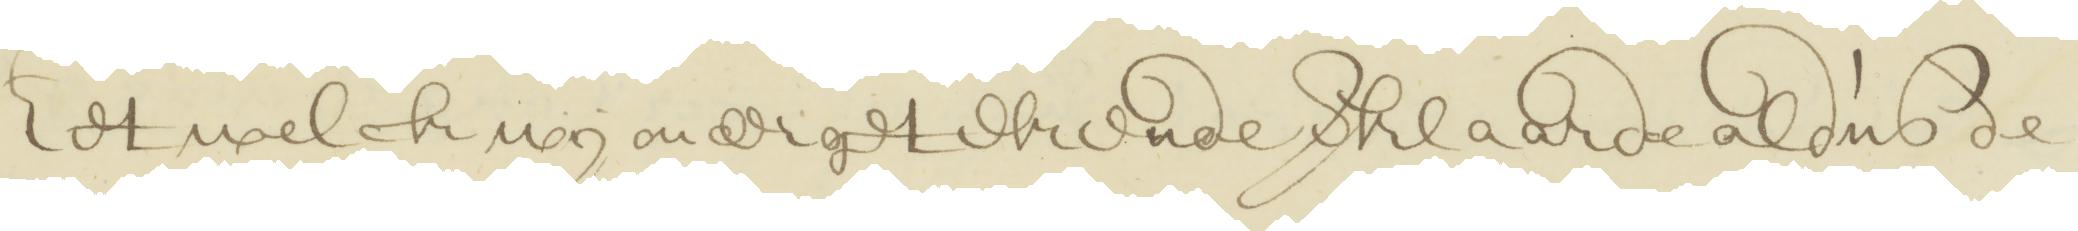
het welck wij onder getekende verklaarde aldus de
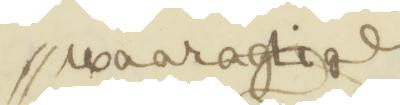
„waaragtige
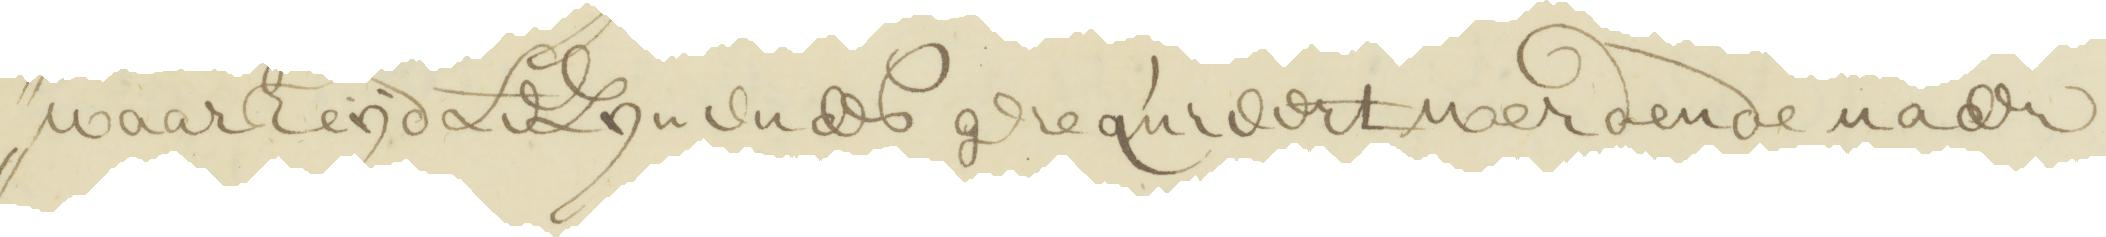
„waarheijd te zijn en des gerequreert werdende nader
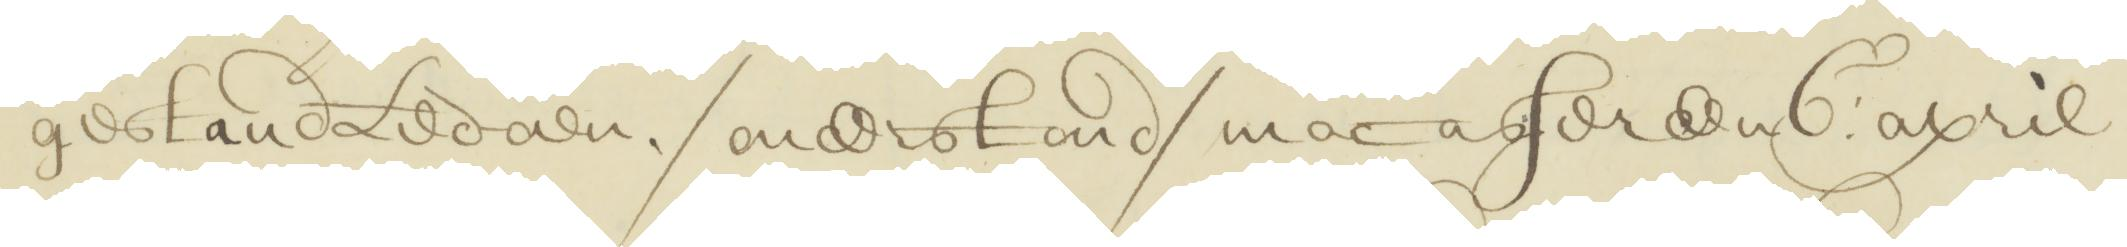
gestand te doen ./onderstond/ macasser den 6:' april
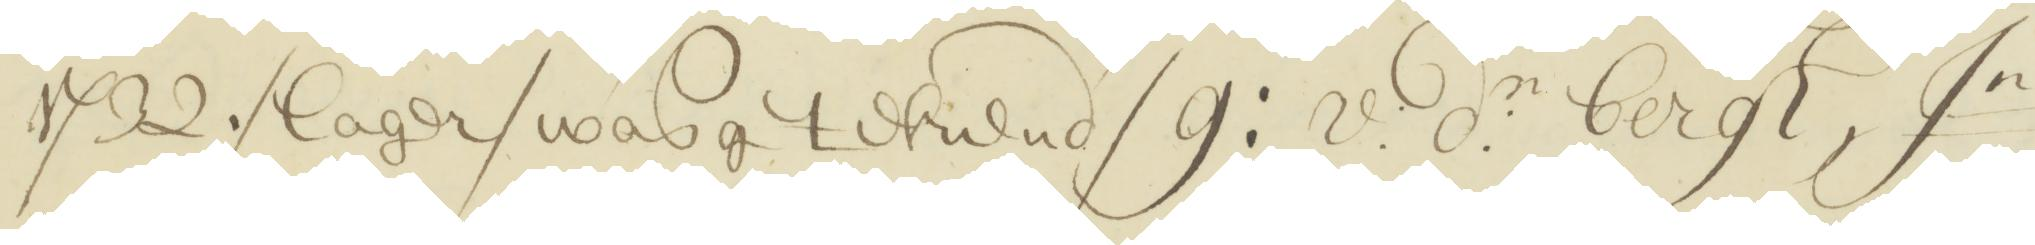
1732 ./lager/ was getekend/ 9: v: d:n bergh, J=n
